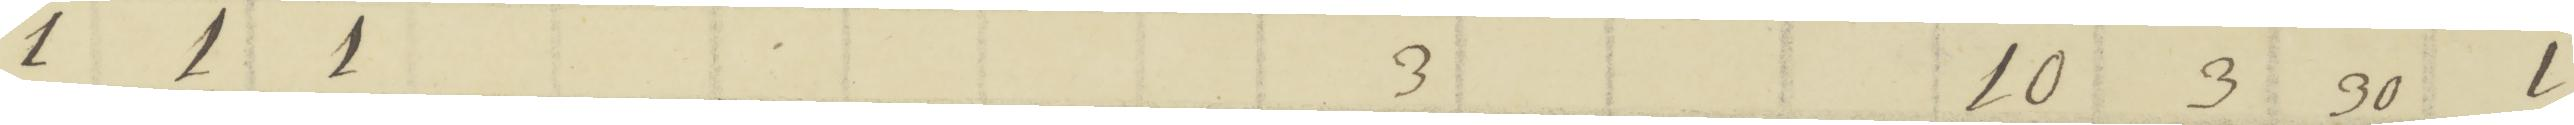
1 1 1 3 10 3 30 1
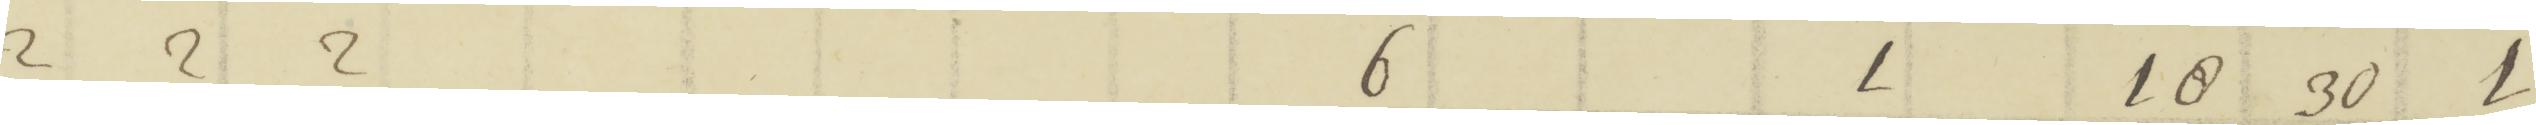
2 2 2 6 1 18 30 1
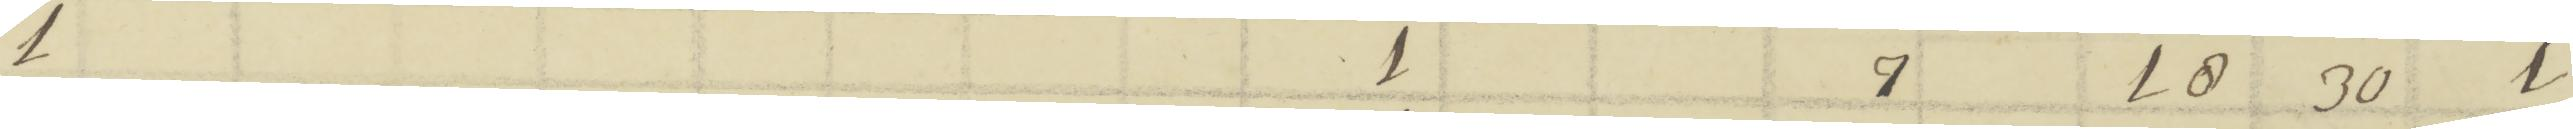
1 1 7 18 30 1
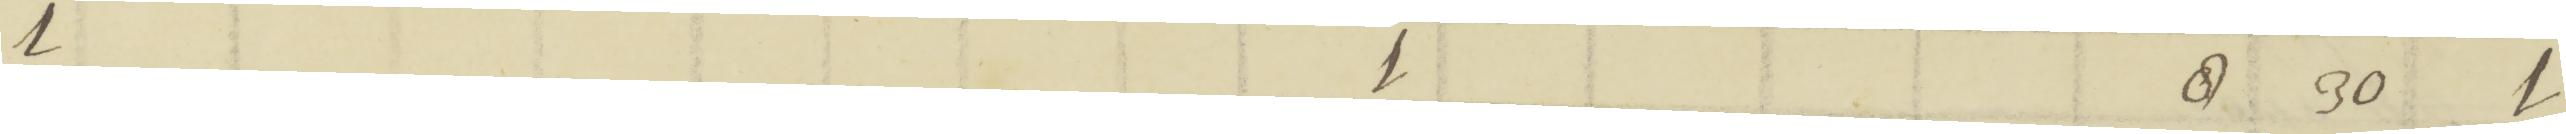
1 1 8 30 1
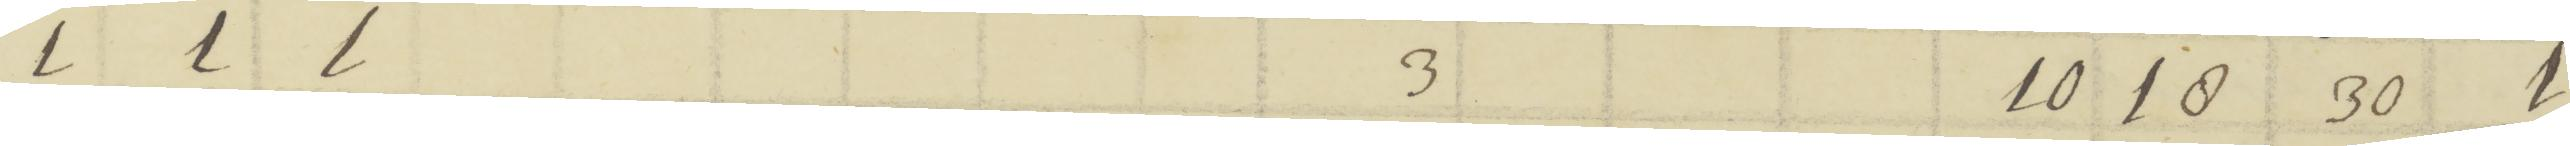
1 1 1 3 10 18 30 1
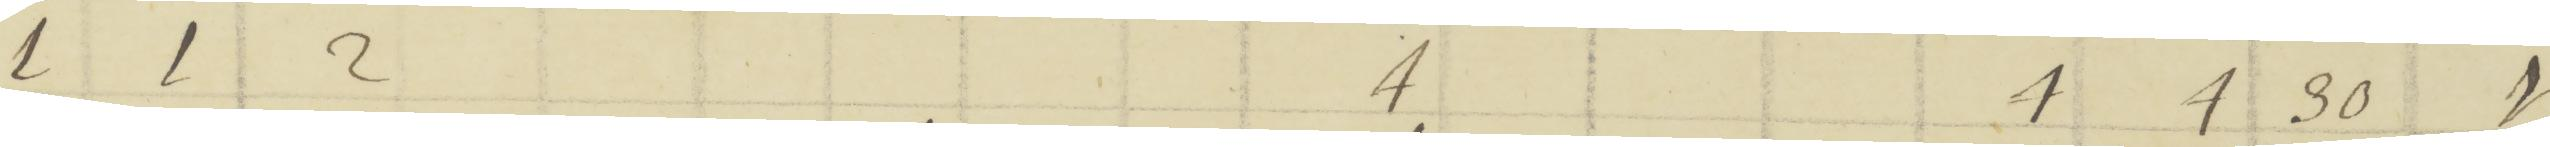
1 1 2 4 4 4 30 1
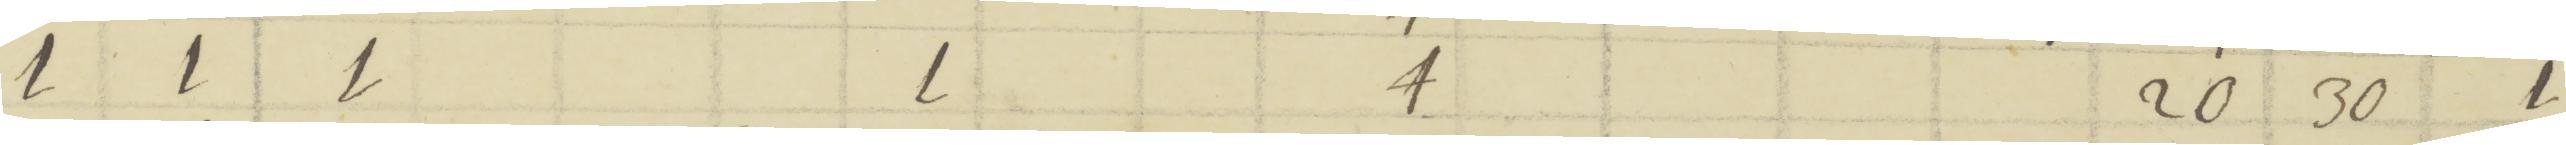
1 1 1 1 4 20 30 1
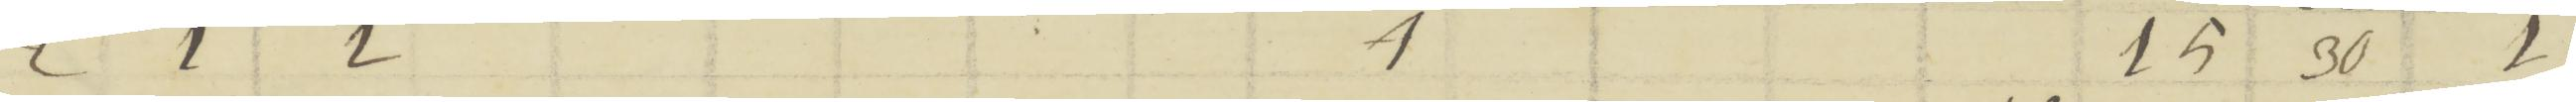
2 1 1 4 15 30 1
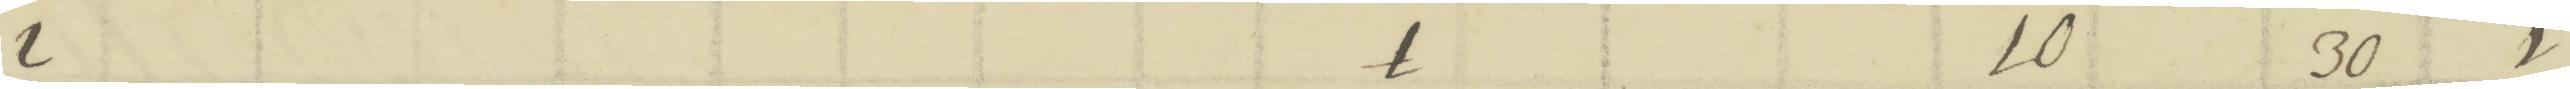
2 1 10 30 1
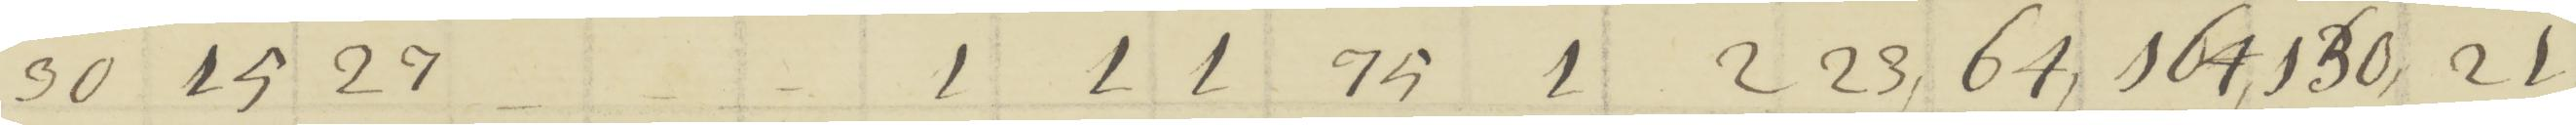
30 25 27 1 1 1 75 1 223, 64, 164,130, 21
